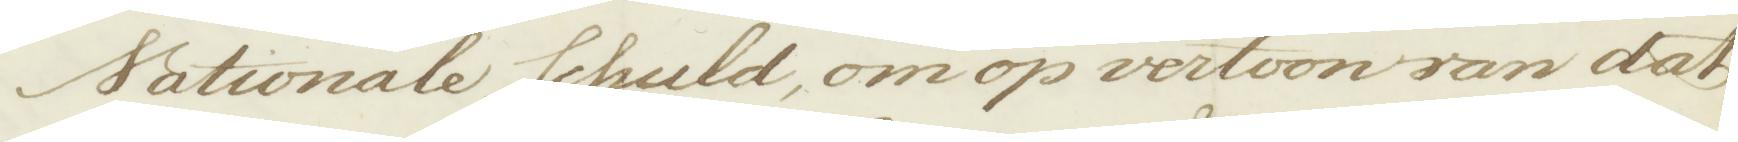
Nationale schuld, om op vertoon van dat
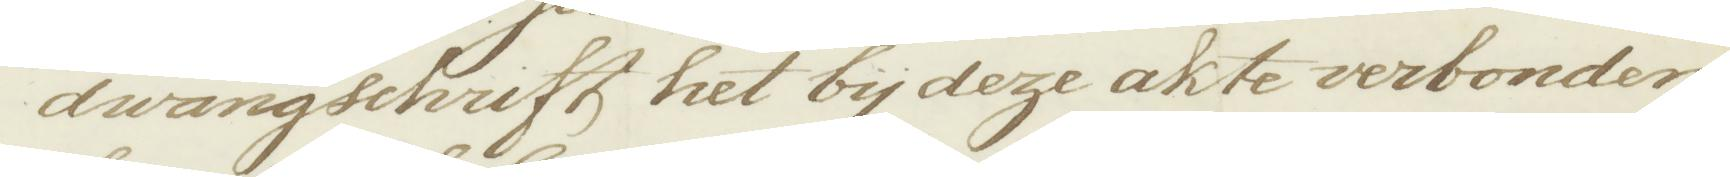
dwangschrift het bij deze akte verbonden
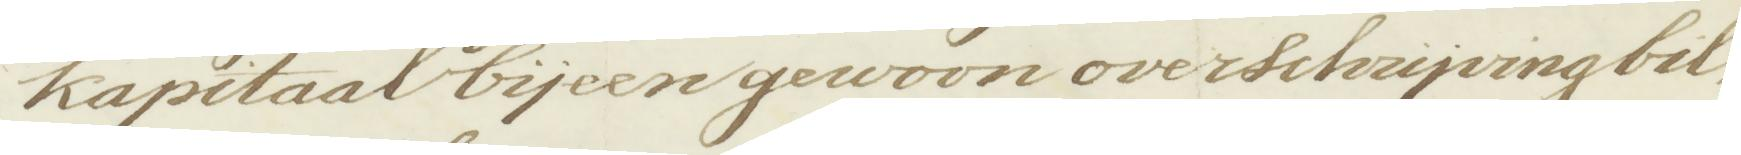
kapitaal bij een gewoon overschrijving bil,
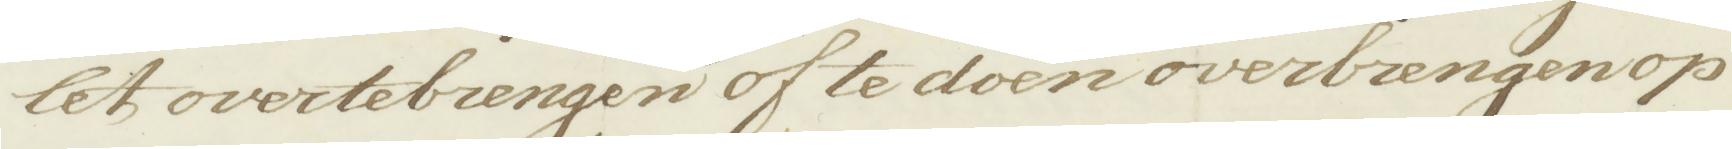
let overtebrengen of te doen overbrengen op
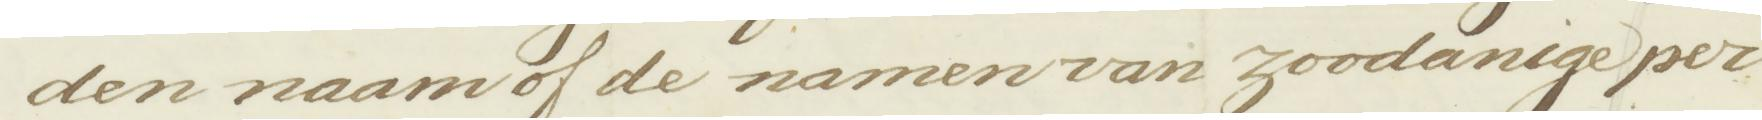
den naam of de namen van zoodanige per„
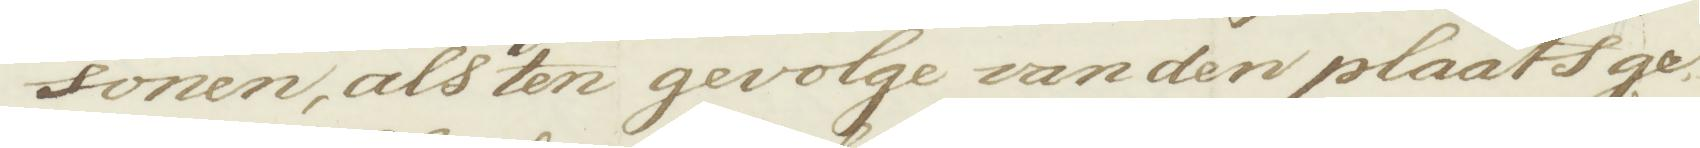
sonen, als ten gevolge van den plaats ge,
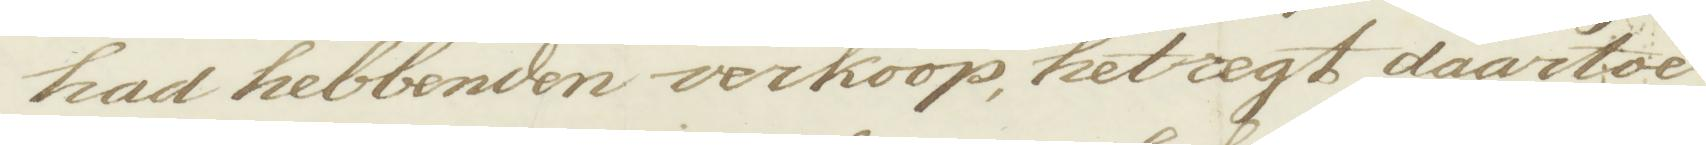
had hebbenden verkoop, het regt daartoe
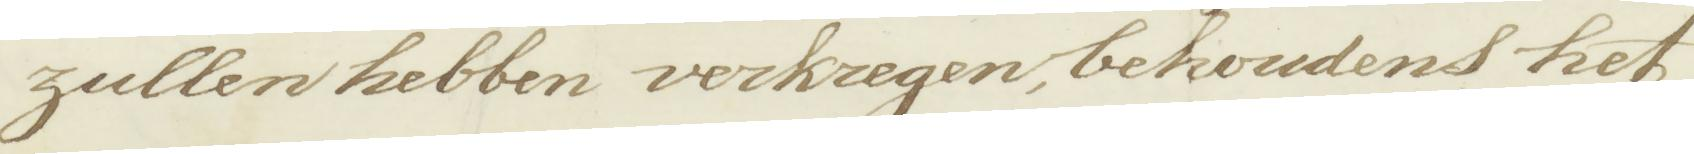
zullen hebben verkregen, behoudens het
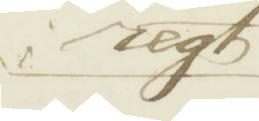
regt
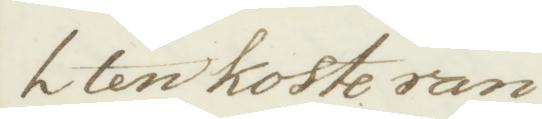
¶ ten koste van
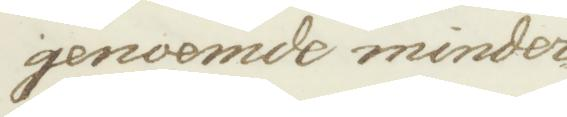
genoemde minder
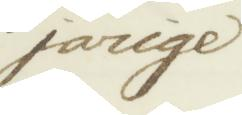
jarige
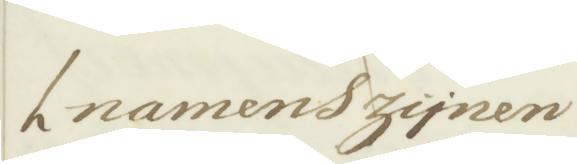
¶ namens zijnen
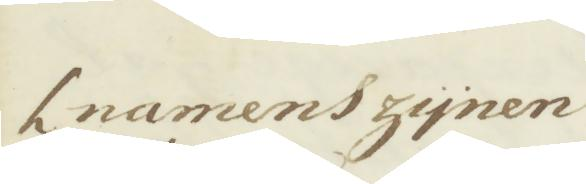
namens zijnen
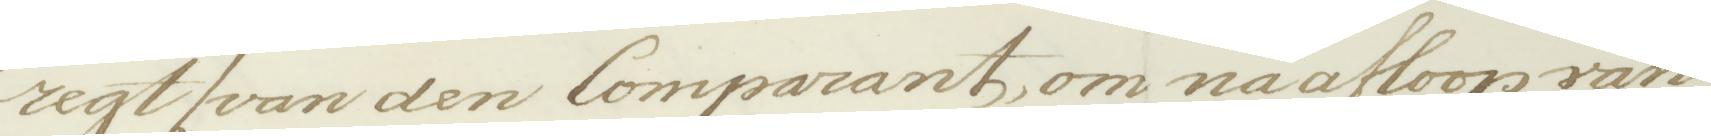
regt van ¶ den Comparant om na afloop van
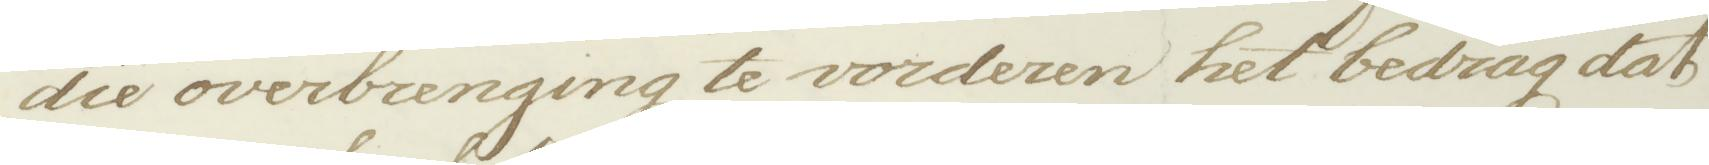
die overbrenging te vorderen het bedrag dat
